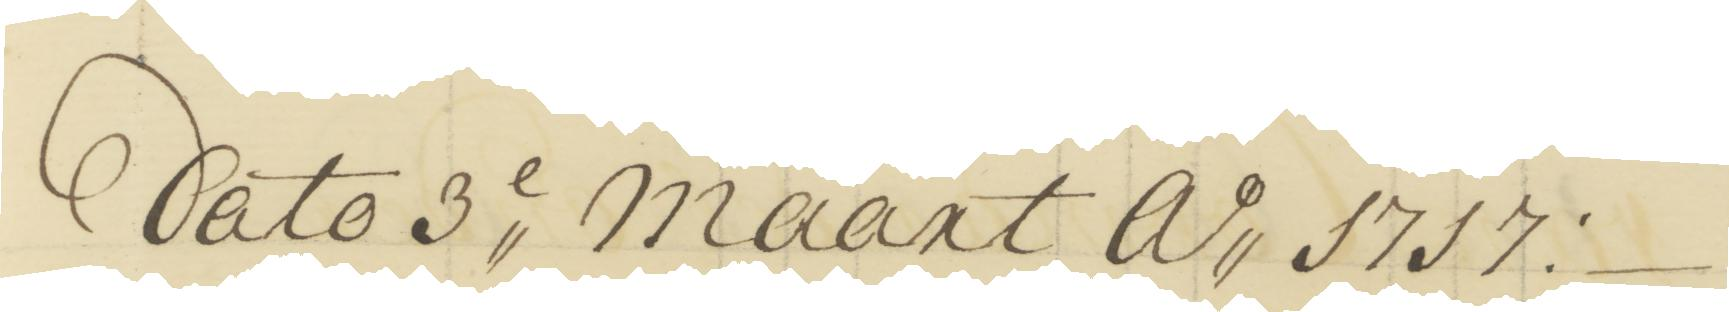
dato 3„e maart a„o 1717:—
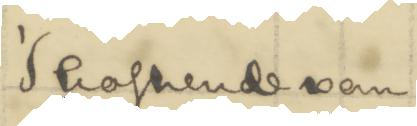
't kostende van
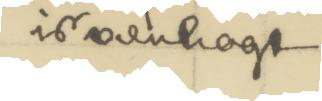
is verkogt
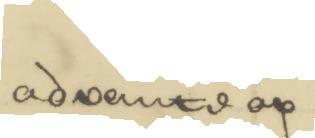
advance op
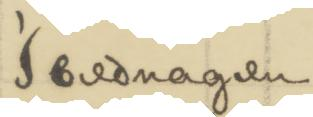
't bedragen
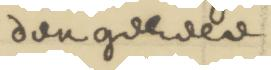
der gehele
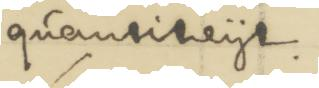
quantiteijt
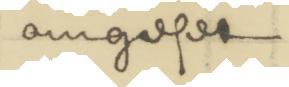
omgeset
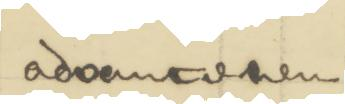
advance ten
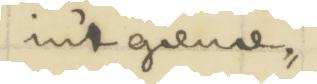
in’t gene„
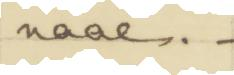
raal.
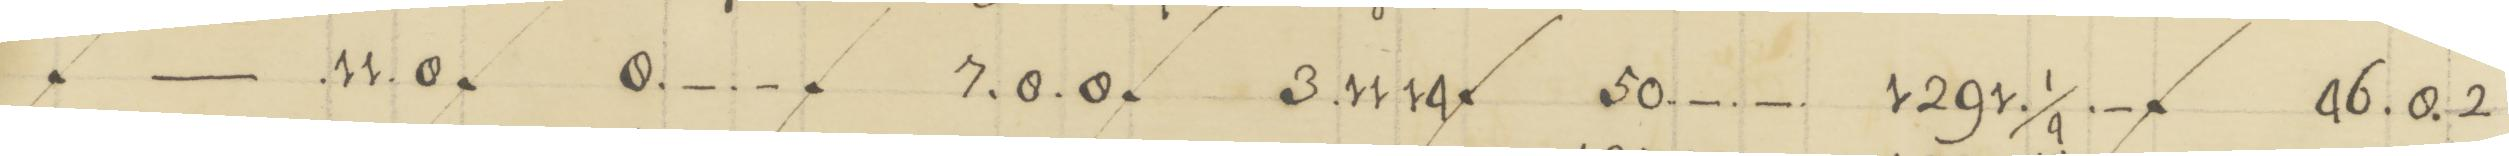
ƒ. — .11.8ƒ 8. —. —ƒ 7.8.8ƒ 3.11.14ƒ 50.—.— 1291.¼.—ƒ 46.8. 2
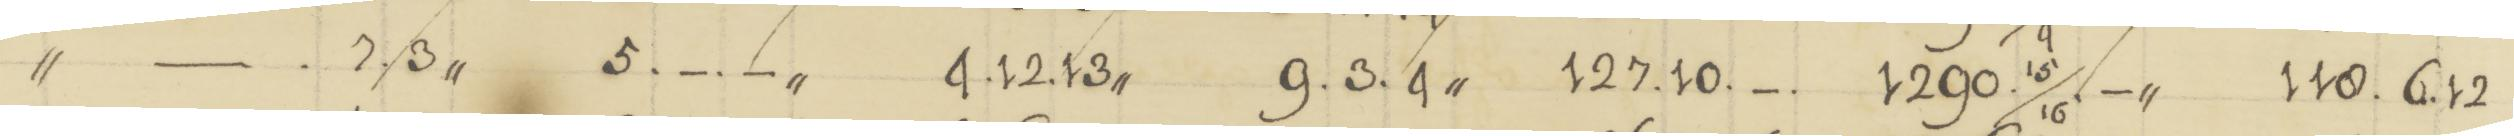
„ — .7. 3„ 5.—.— „ 4.12.13„ 9.3.4„ 127.10.—. 1290.15/16.—„ 118.6.12
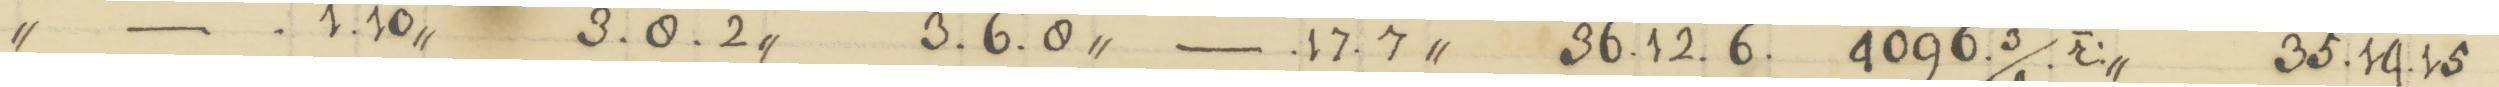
„ — .1.10„ 3:8.2„ 3.6.8 „ — 17.7„ 36.12.6. 4096.¾.r:„ 35.14.15
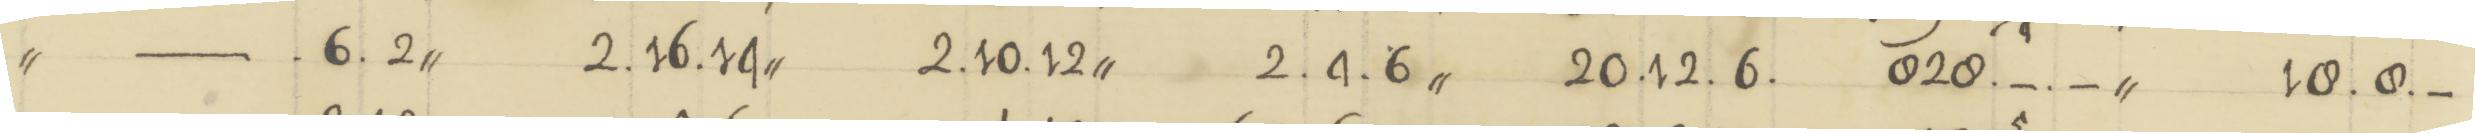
„ — .6.2„ 2.16.14„ 2.10.12„ 2:4.6„ 20.12.6. 828.—.—„ 18.8. —
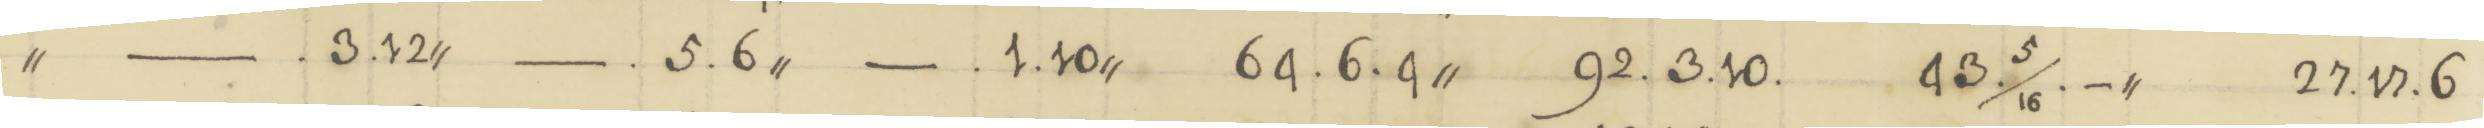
„ — .3.12„ — .5.6„ — .1.10„ 64.6.4„ 92.3.10. 43.5/16.—„ 27.17.6
